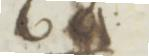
64:
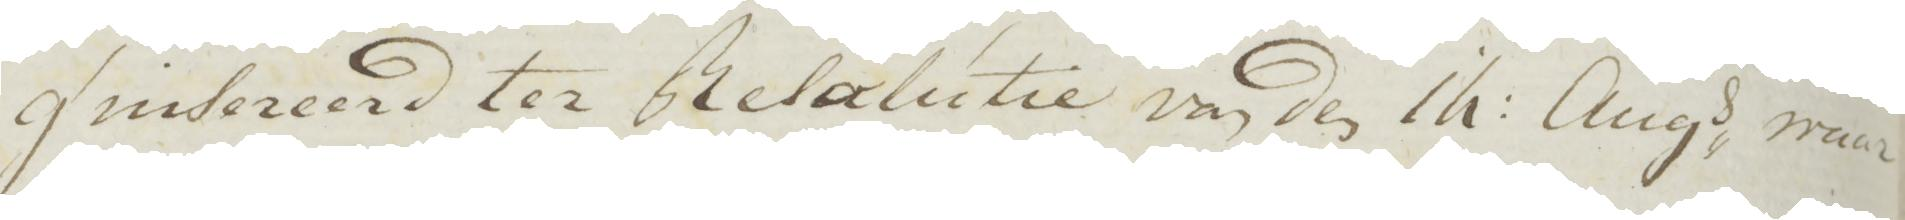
g’insereerd ter Resolutie van den 14: Aug„s waar
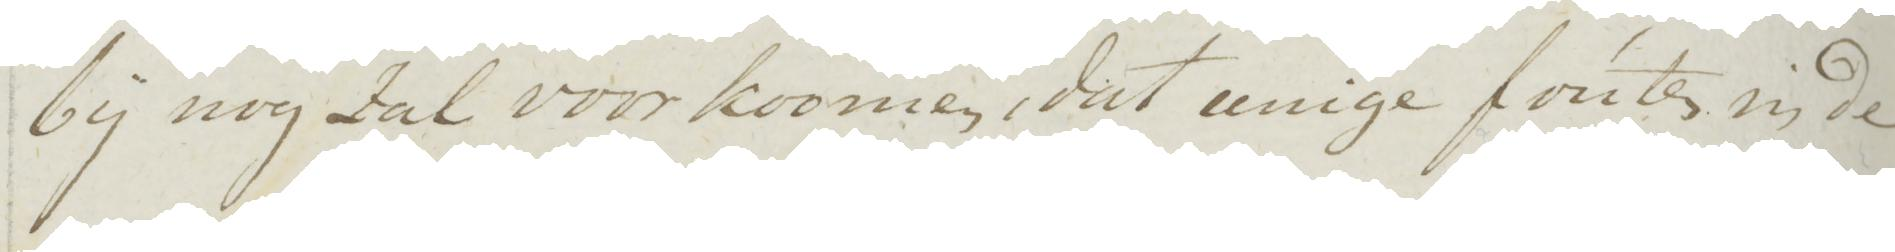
bij nog zal voor koomen, dat eenige fouten in de
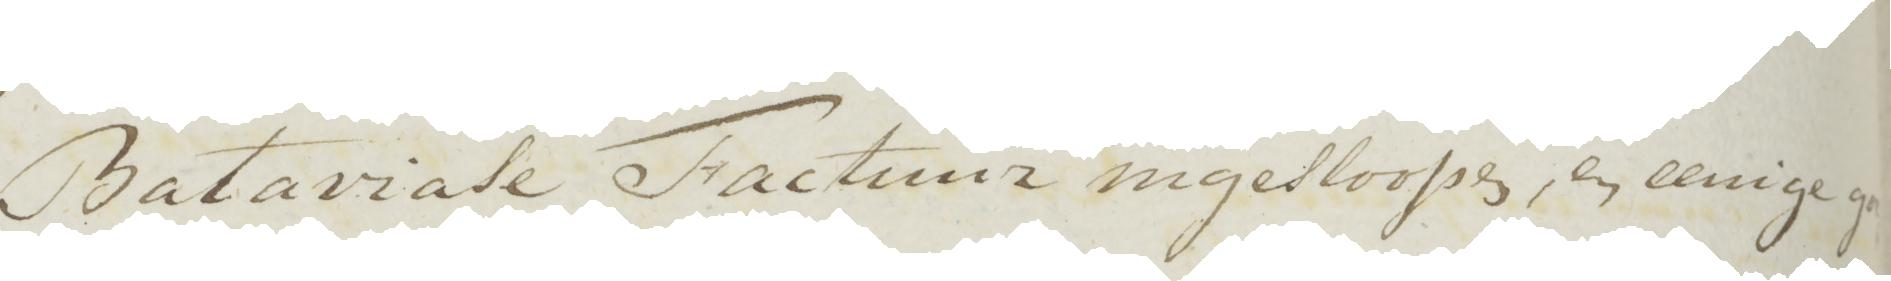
Bataviase Factuur ingesloopen, en eenige go
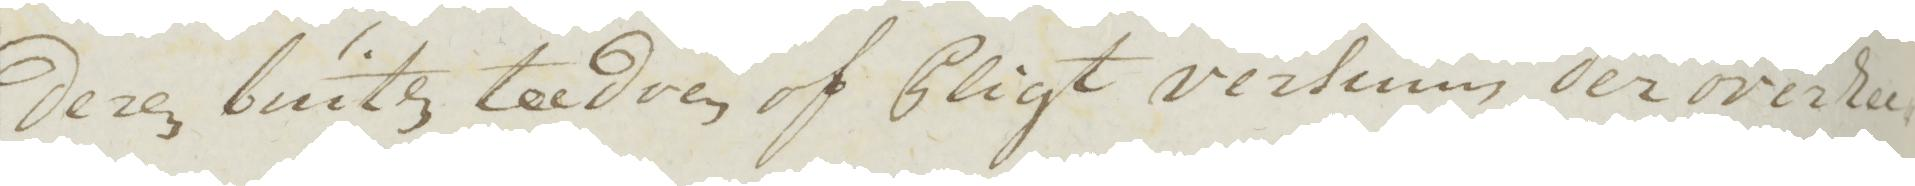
deren buiten toedoen of pligt versuim der overhee
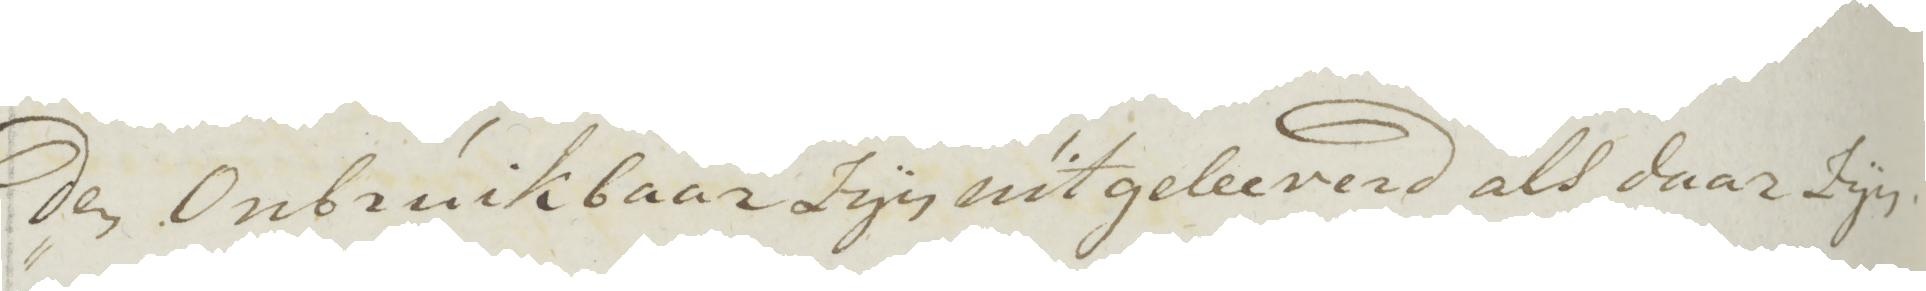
„den onbruikbaar zijn uitgeleeverd als daar zijn
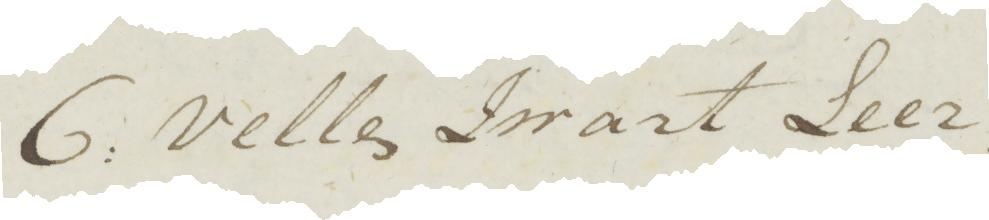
6: vellen zwart Leer
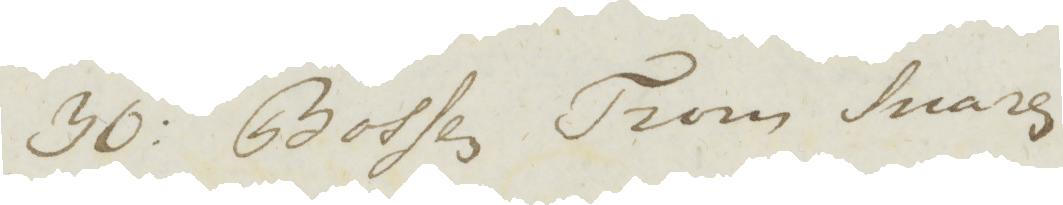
30: Bossen Trom Snaren
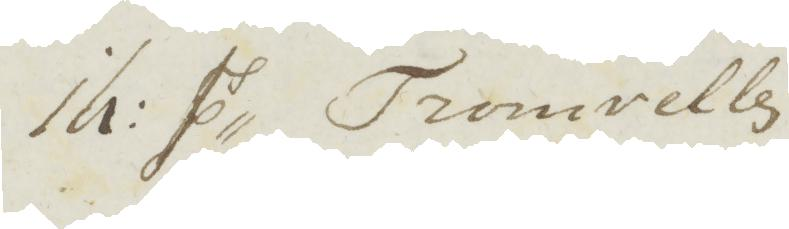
14: p„s Tromvellen.
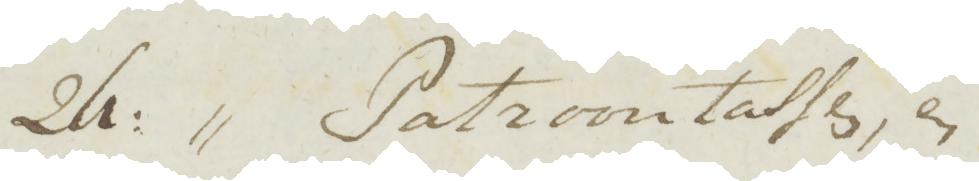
24: „ Patroontassen, en
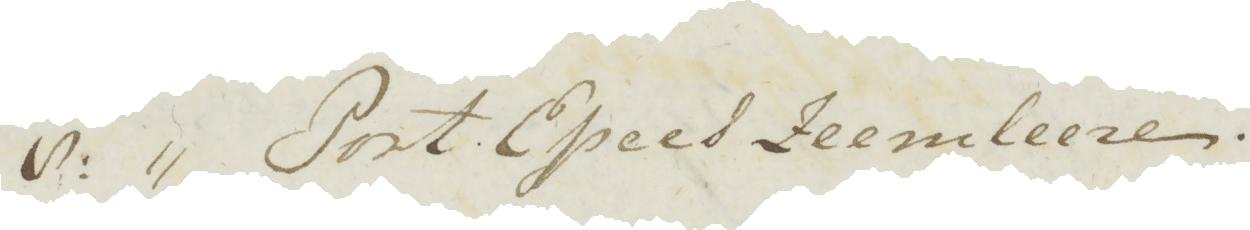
8: „ Port Epees zeemleeren.
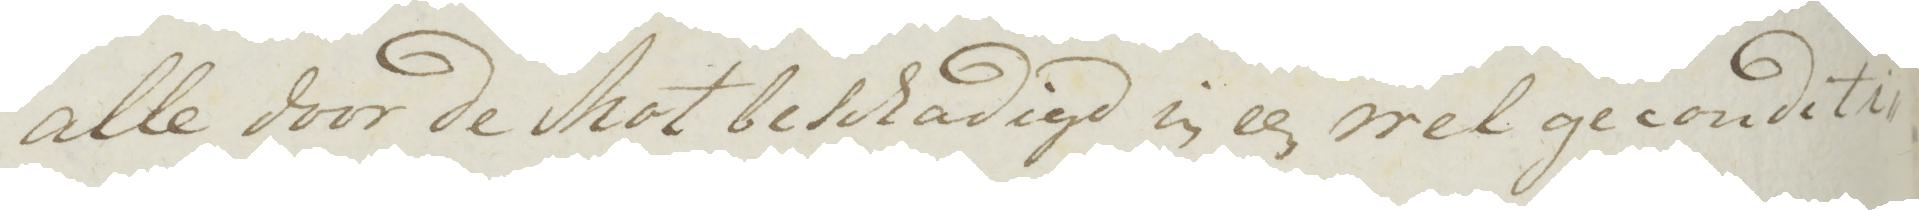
alle door de Mot beschadigd in een wel geconditi„
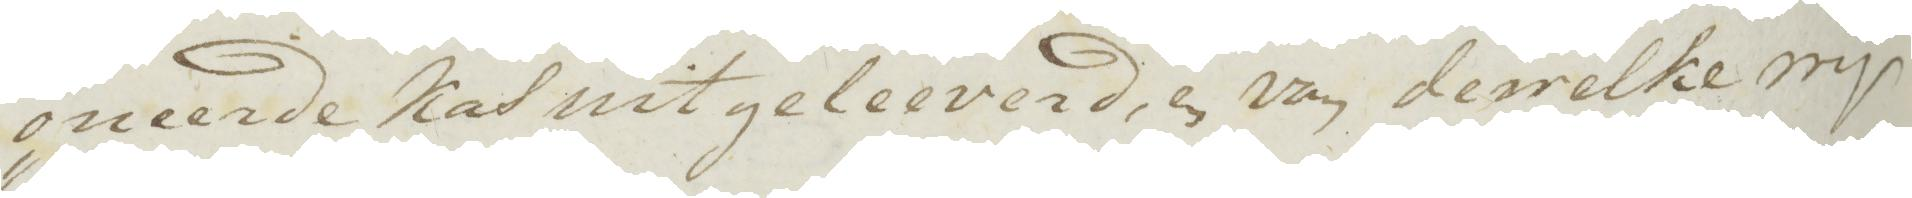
oneerde kas uitgeleeverd, en van, dewelke wij
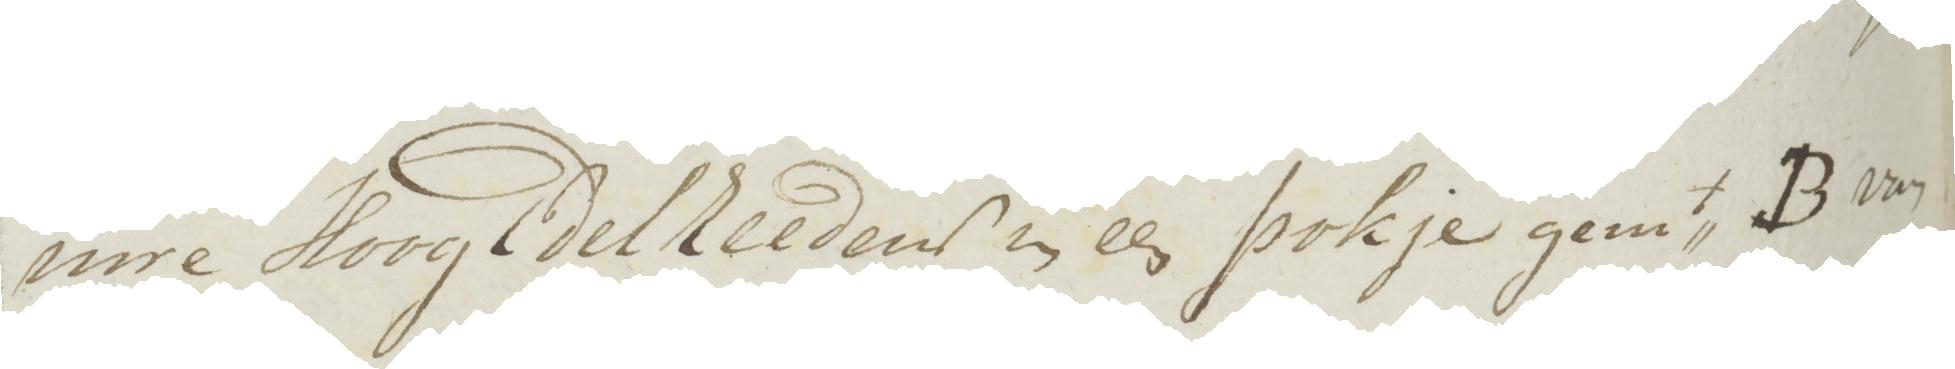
uwe Hoog Edelheedens in een pokje gem„t B van
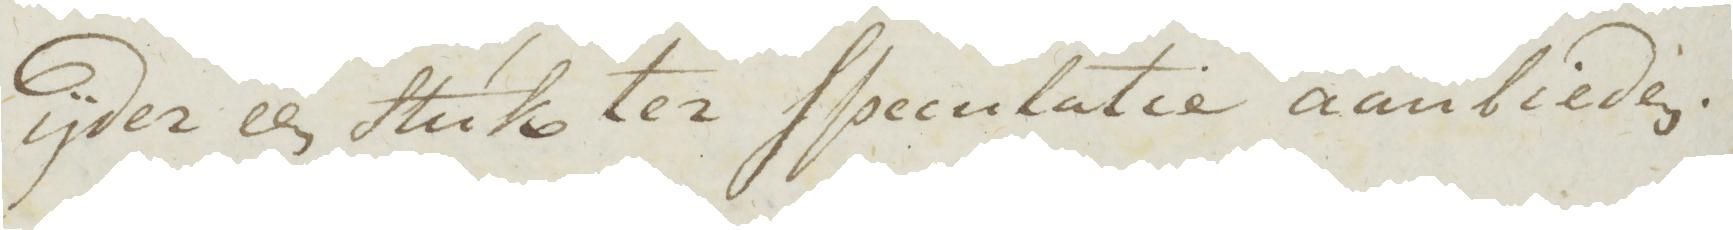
ijder een stuk ter speculatie aanbieden
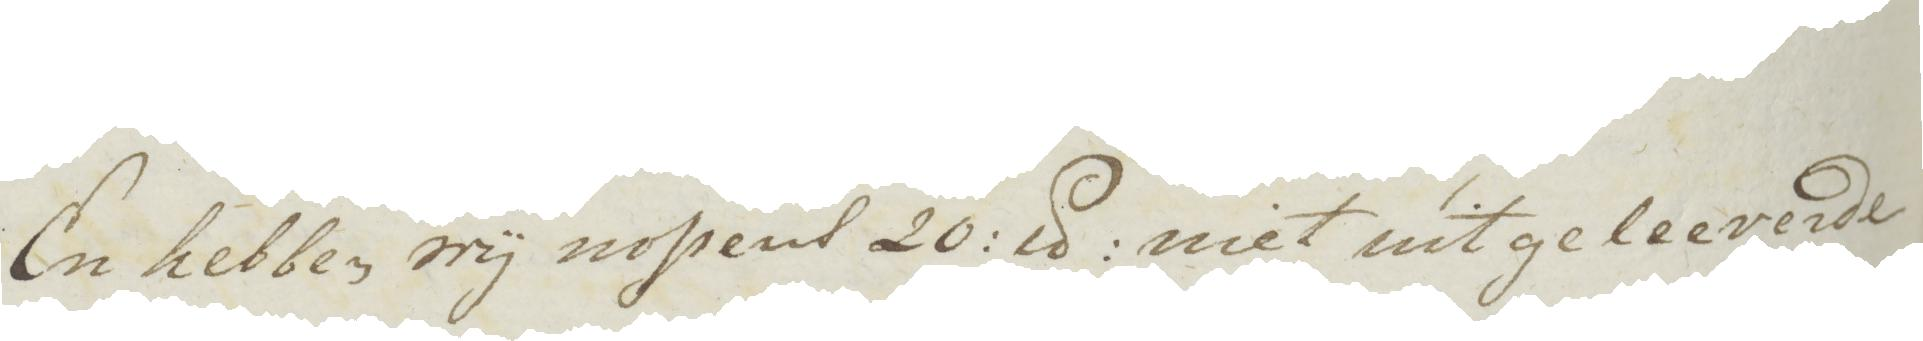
En hebben wij nopens 20: id: niet uitgeleeverde
